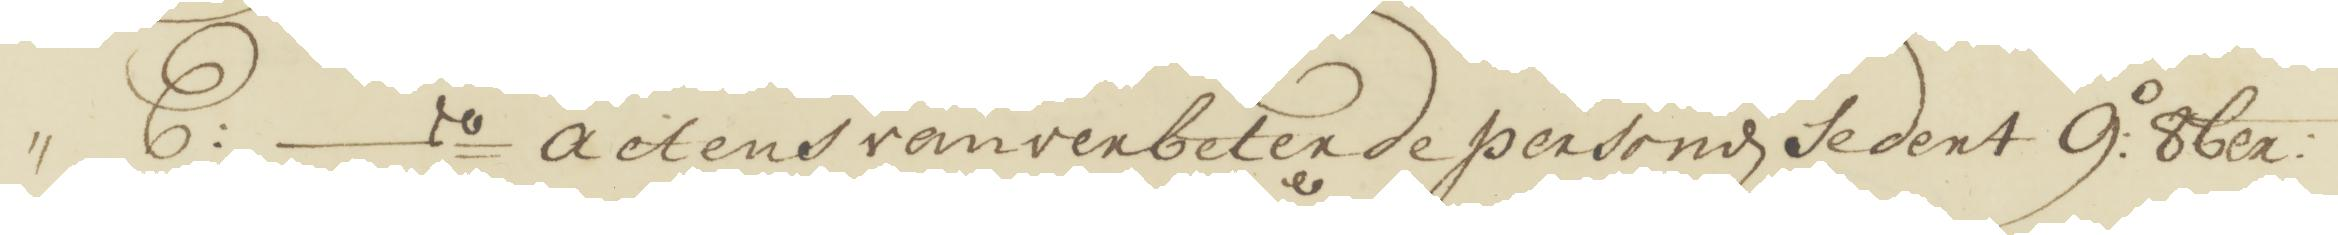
„ E: _=o actens van verbeterde personen sedert 9:e 8ber:
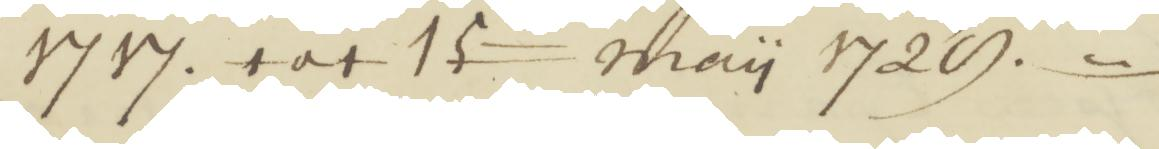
1717. tot 15=e maij 1728. —
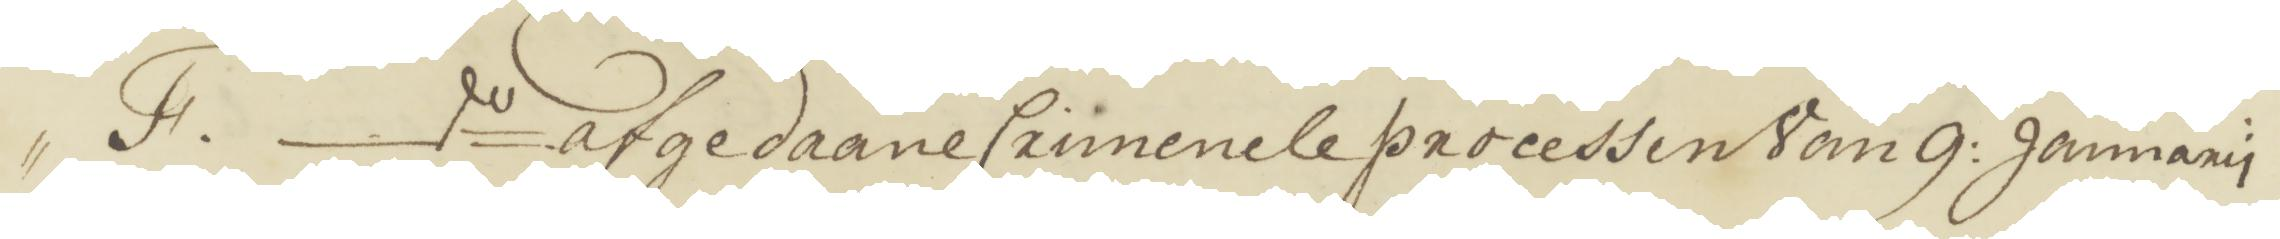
„ F. _=o. afgedaane Crimenele processen van 9:e Januarij
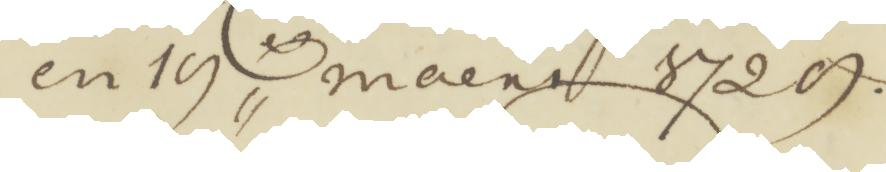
en 19„e maert 1728
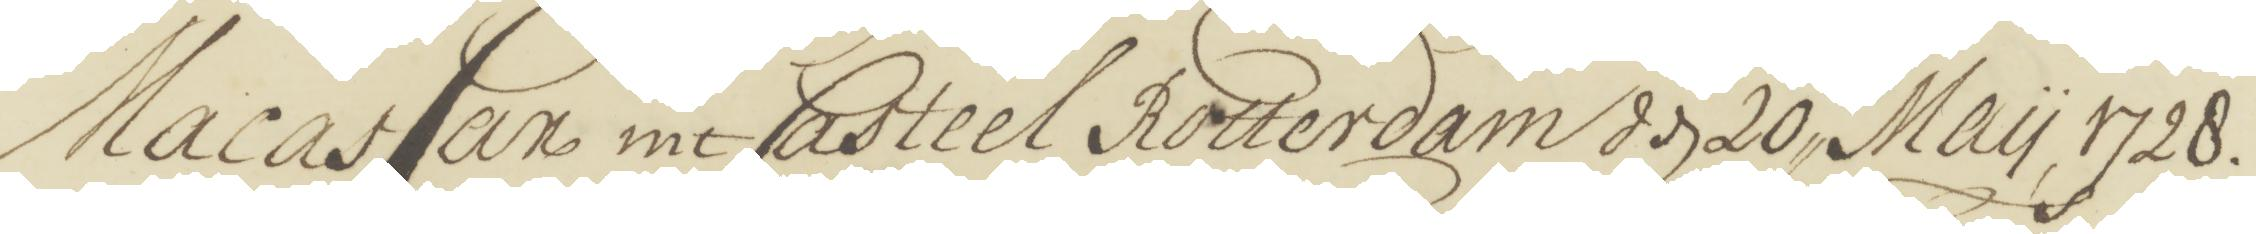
Macassar in't Casteel Rotterdam den 20„e Maij 1728.
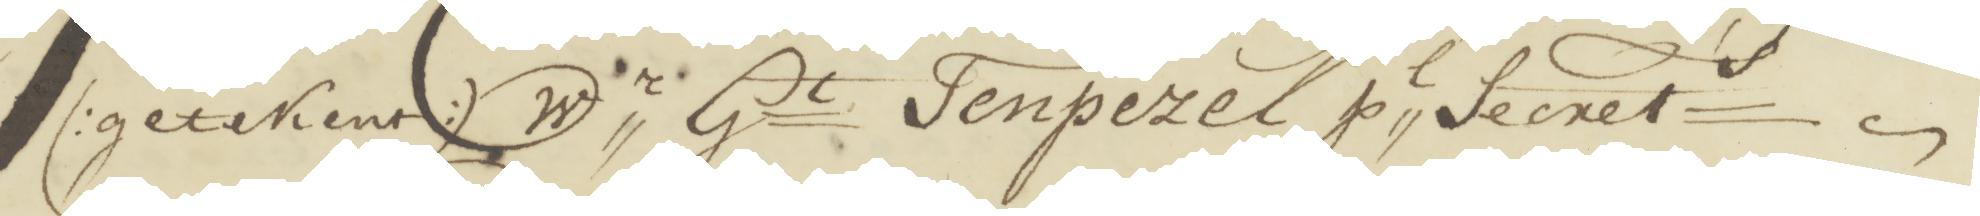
(:getekent) W„r G=t Tenpezel p„l secret=s —
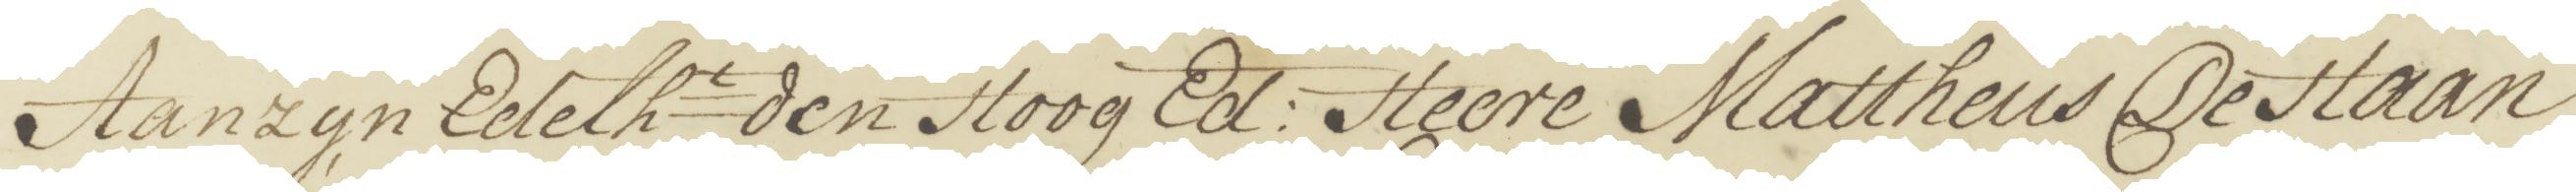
Aan zyn Edelh=t den Hoog Ed: Heere Mattheus De Haan
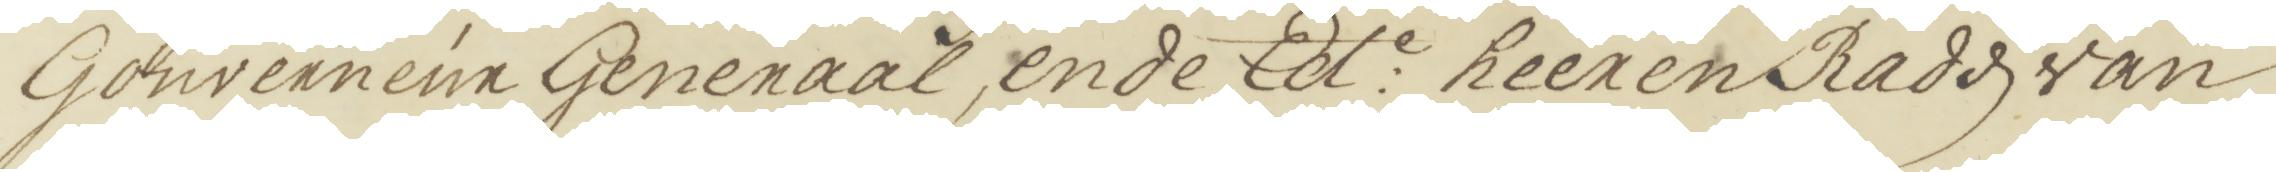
Gouverneur Generaal, ende Ed:e heeren Raden van
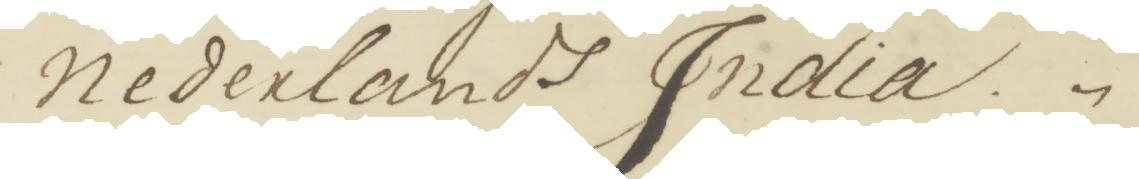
nederlands Jndia. —
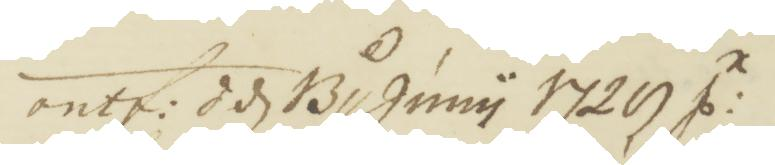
ontf: den 13„e Junij 1728 p:r
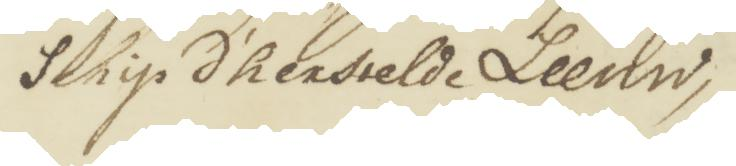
schip d’herstelde Leeuw,
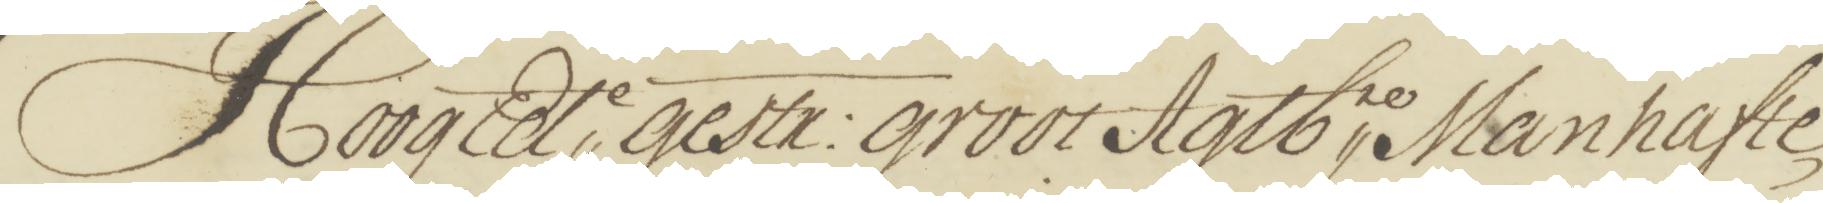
Hoog Ed„e gestr: groot Agtb„re Manhafte
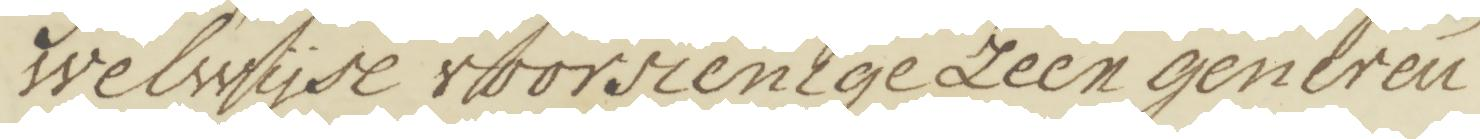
welwijse voorsienige zeer geneveu
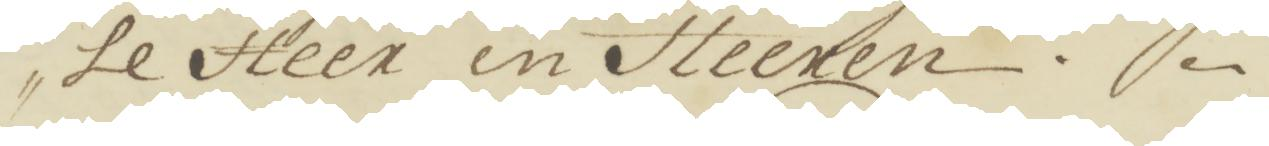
„se Heer en Heeren. —
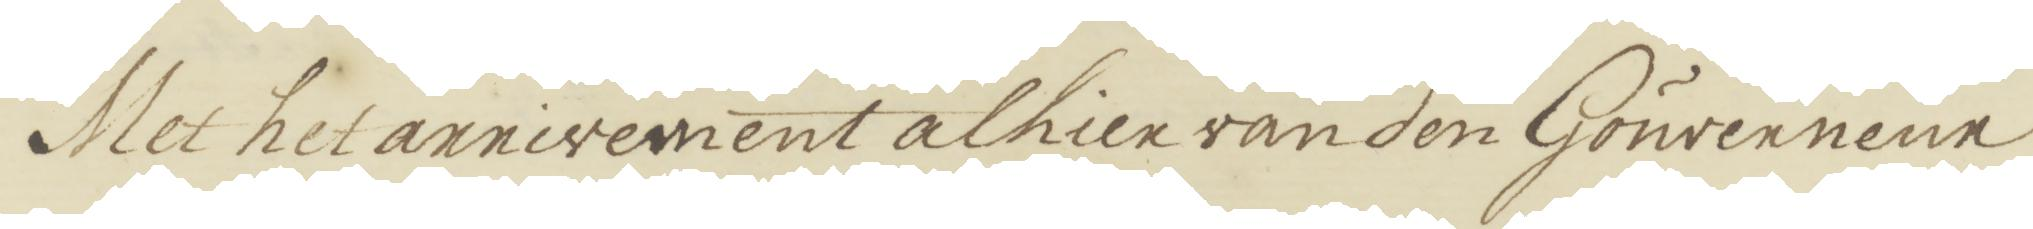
Met het arrivement alhier van den Gouverneur
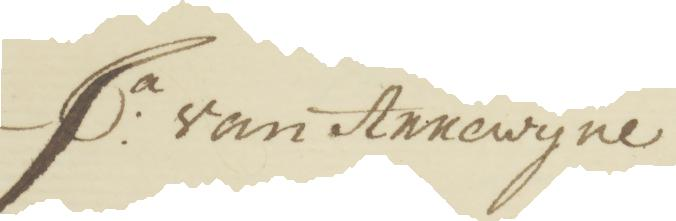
J:n van Arrewijne
